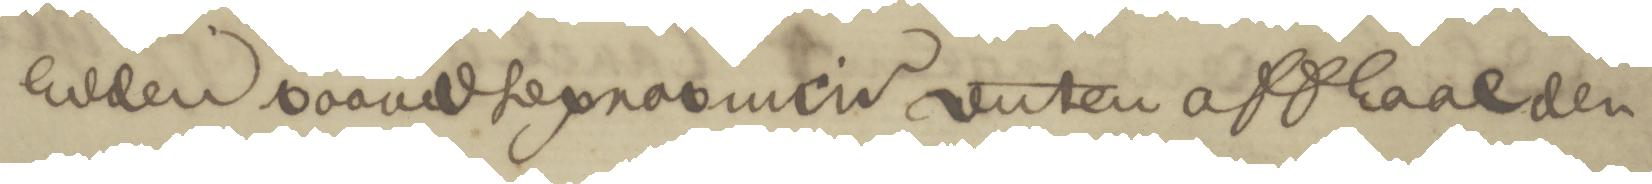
heden voor dese provincie enten affhaalden
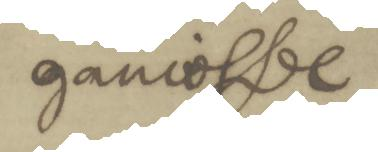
ganiessel
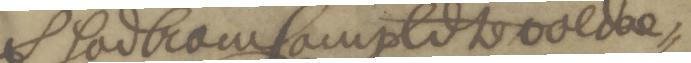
versoekom Complete voldoe„
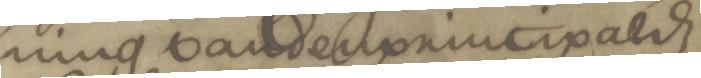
ning vandenprincipalen
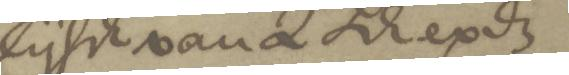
Eijsch van 2 schepen
